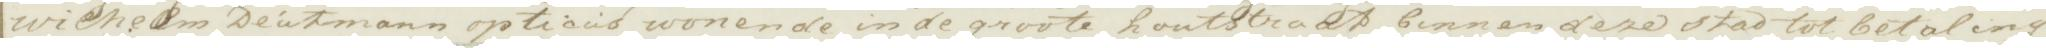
wilhelm Deutmann opticus wonende in de groote houtstraat binnen deze stad tot betaling
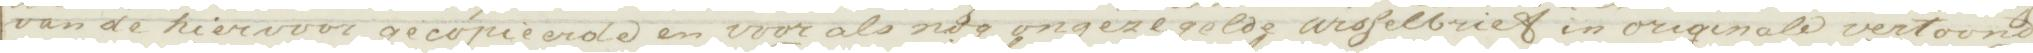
van de hiervoor gecopieerde en voor als nog ongezegelde wisselbrief in originale vertoond
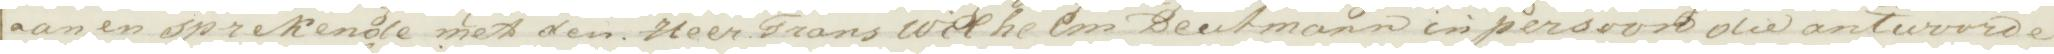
aan en sprekende met den Heer Frans Wilhelm Deutmann in persoon die antwoorde
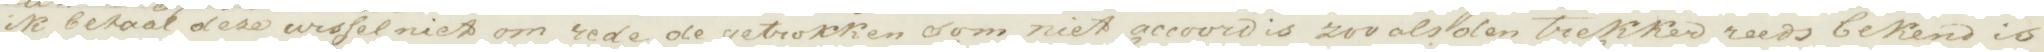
ik betaal deze wissel niet om rede de getrokken som niet accoord is zoo als den trekker reeds bekend is
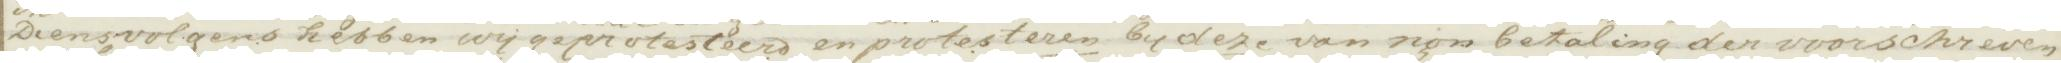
Diens volgens hebben wij geprotesteerd en protesteren by deze van non betaling der voorschreven
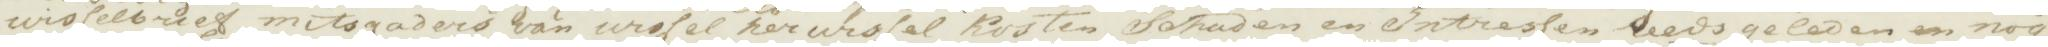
wisselbrief mitsgaders van wissel herwissel kosten schaden en Intressen reeds geleden en nog
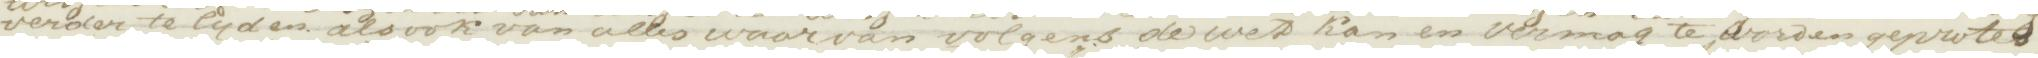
verder te lyden als ook van alles waarvan volgens de wet kan en vermag te worden geprotes
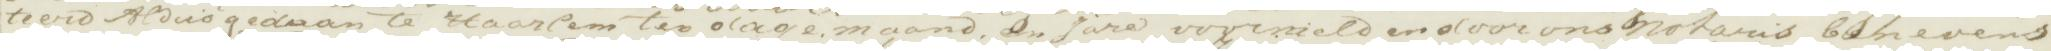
teerd Aldus gedaan te Haarlem ten dage, maand, Jare voormeld en door ons notaris benevens
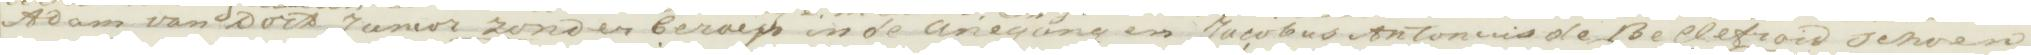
Adam van Dort Junior zonder beroep in de anegang en Jacobus Antonius de Bellefroid schoen
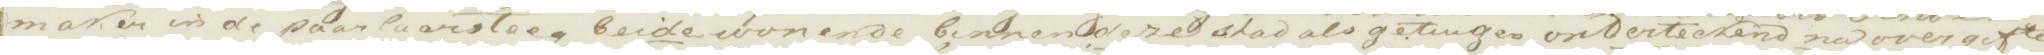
maker in de paarlaarsteeg beide wonende binnen deze stad als getuigen onderteekend na overgifte
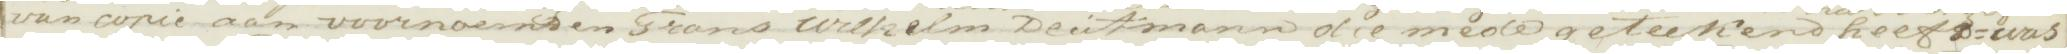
van copie aan voornoemden Frans Wilhelm Deutmann die mede geteekend heeft = was
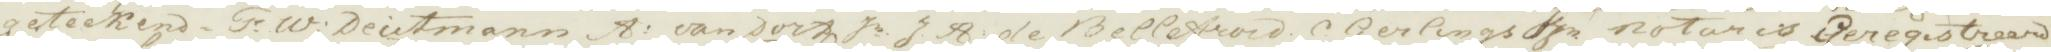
geteekend - F. W: Deutmann A: van Dort J.r. J A: de Bellefroid, C Gerlings Jr. notaris Geregistreerd
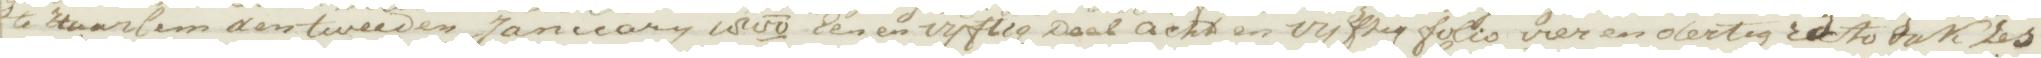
te Haarlem den tweeden January 1800 Een en vyftig Deel acht en vyftig folio vier en dertig recto vak zes
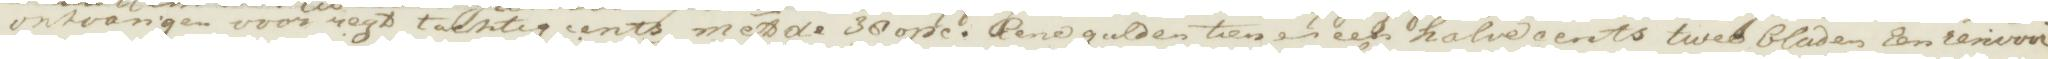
ontvangen voor regt tachtig cents met de 38 opc. Eene gulden tien en een halve cents twee bladen Een renvooi
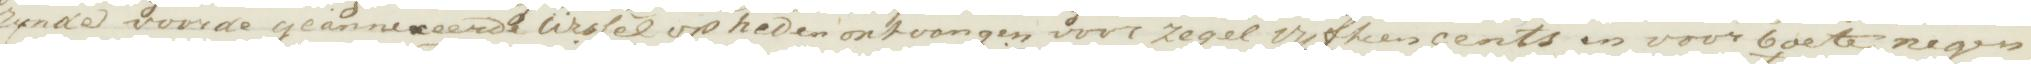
zynde voor de geannexeerde wissel op heden ontvangen voor zegel vyftien cents en voor boete negen
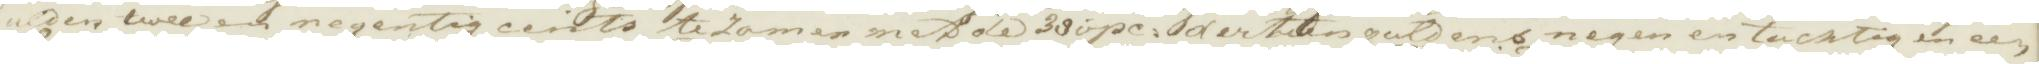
gulden twee en negentig cents te zamen met de 38 opc: dertien guldens negen en tachtig en een
